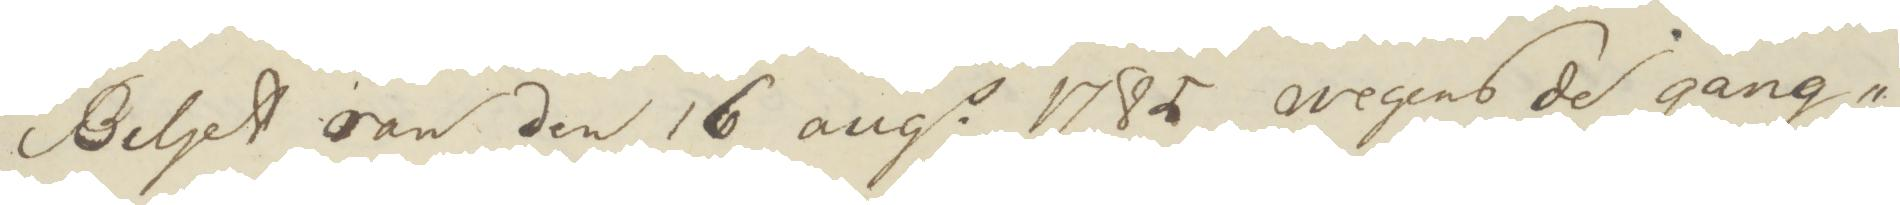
Biljet van den 16 aug.s 1785 wegens de gang „
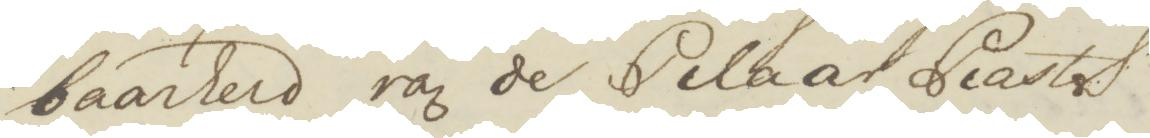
baarheid van de Pilaar Piasts
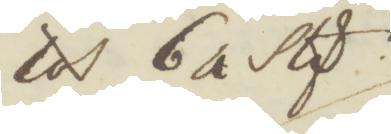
tot 64 Stver .
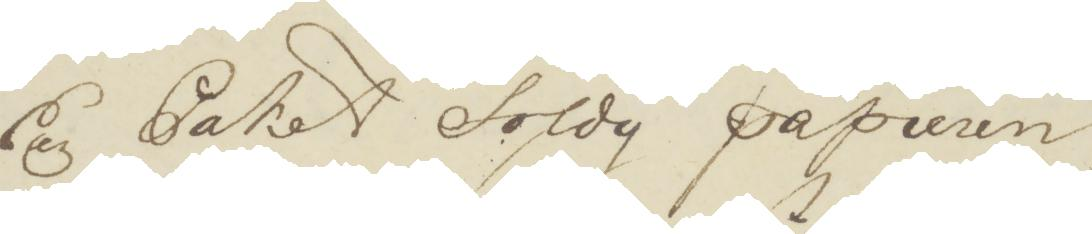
Een Paket Soldy Papieren
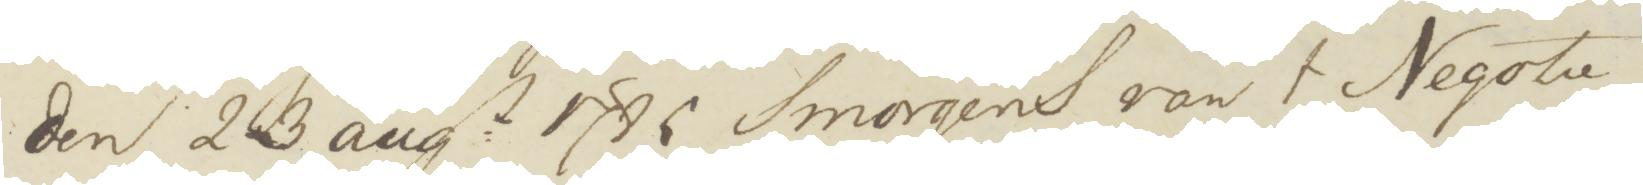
den 23 aug:s 1785 Smorgens van t Negotie
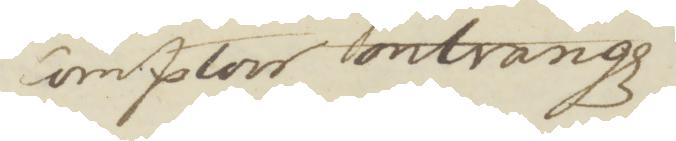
Comptoir ontvangen
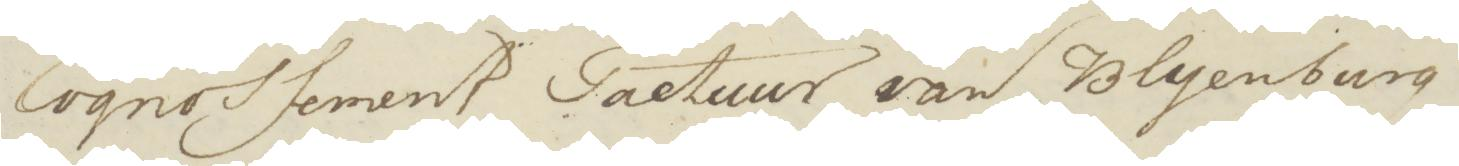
Cognossement Factuur van Blyenburg
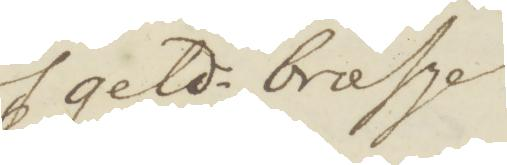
f geld= briefje
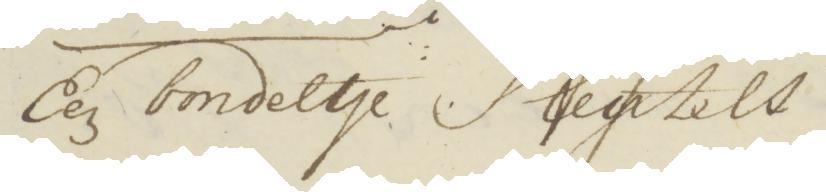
Een bondeltje Sleutels
